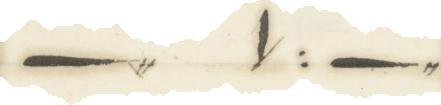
— „ 1: —„
